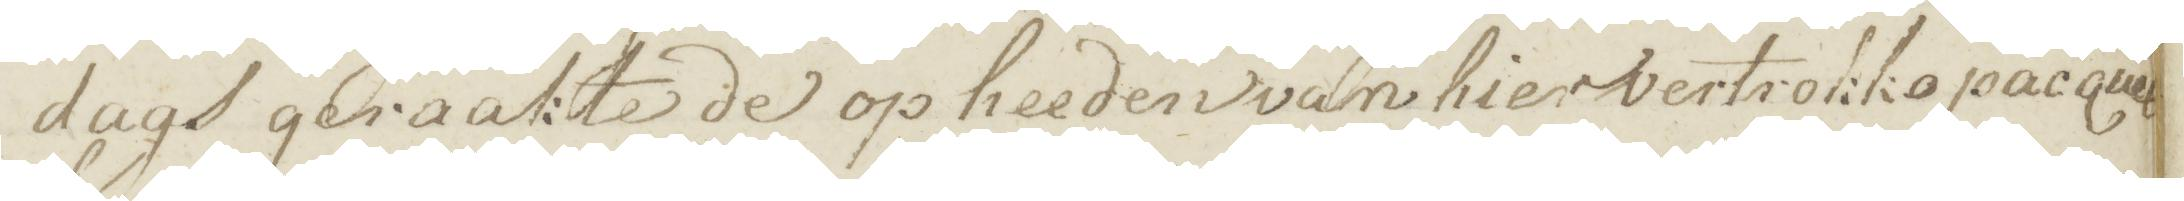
dags geraakte de op heeden van hier vertrokke pacque
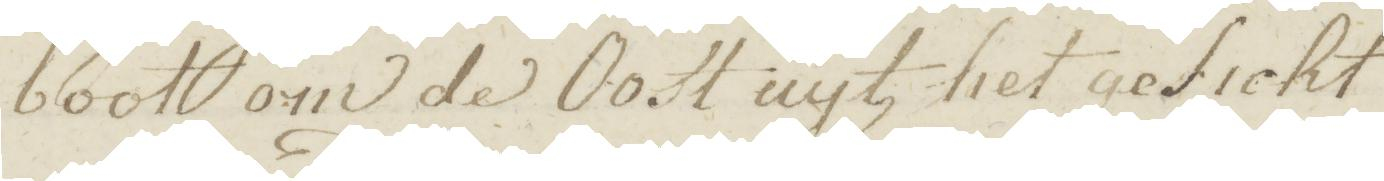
boot om de Oost uyt het gesicht
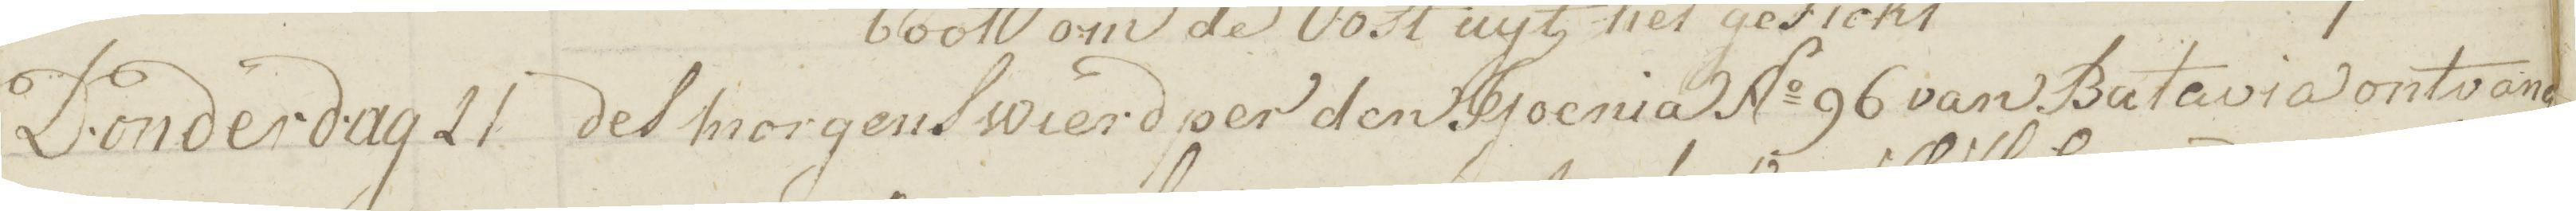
Donderdag 21 des morgens wierd per den Tjoenia N=o 96 van Batavia ontvang
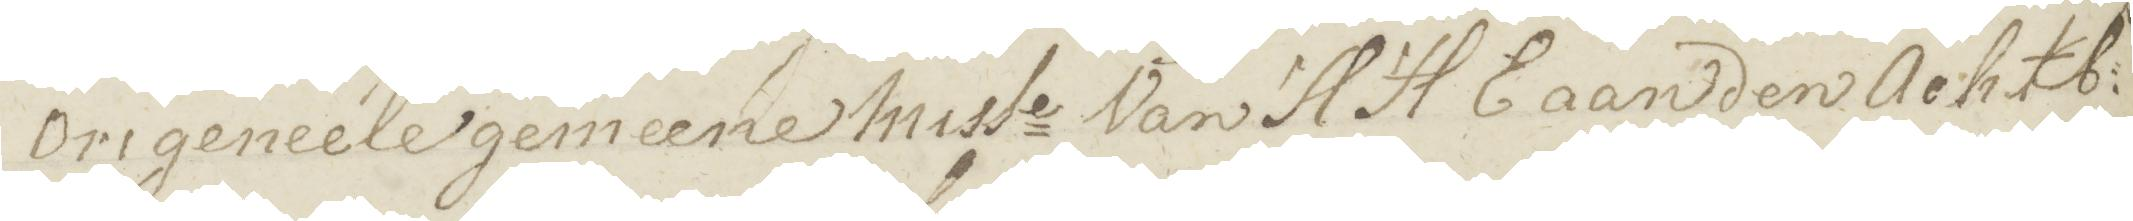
Origeneele gemeene miss=e van 'H 'H E aan den Achtb:
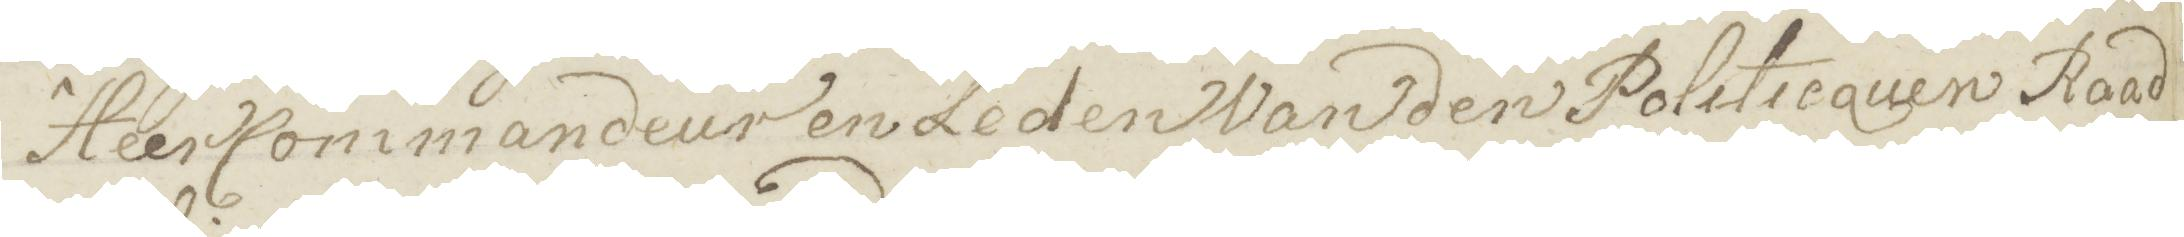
Heer Commandeur en leden van den Politicquen Raad
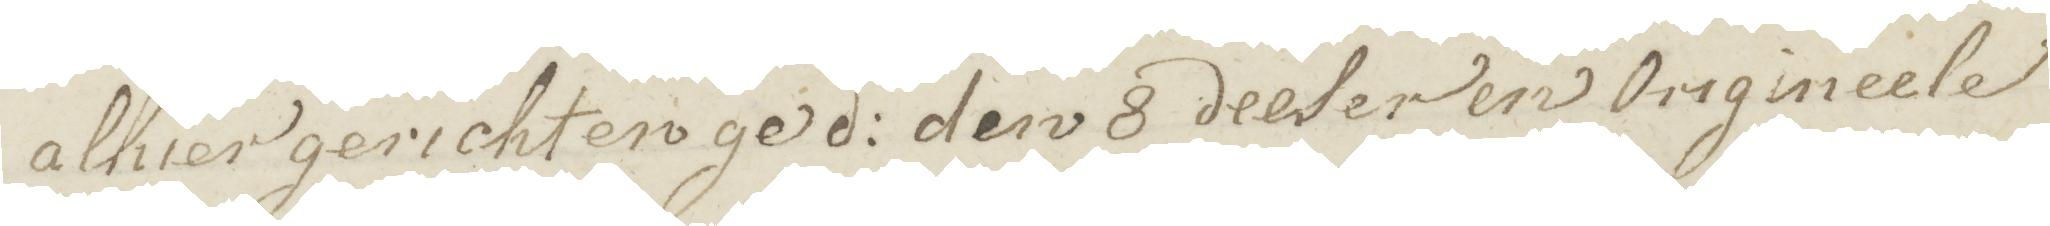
alhier gerichten ged: den 8 deeser en Origineele
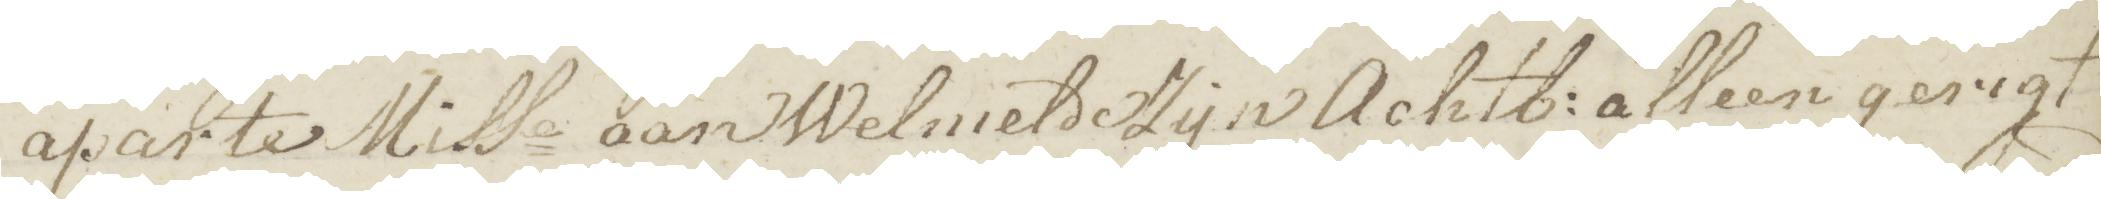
aparte Miss=e aan Welmelde zijn Achtb: alleen gerigt
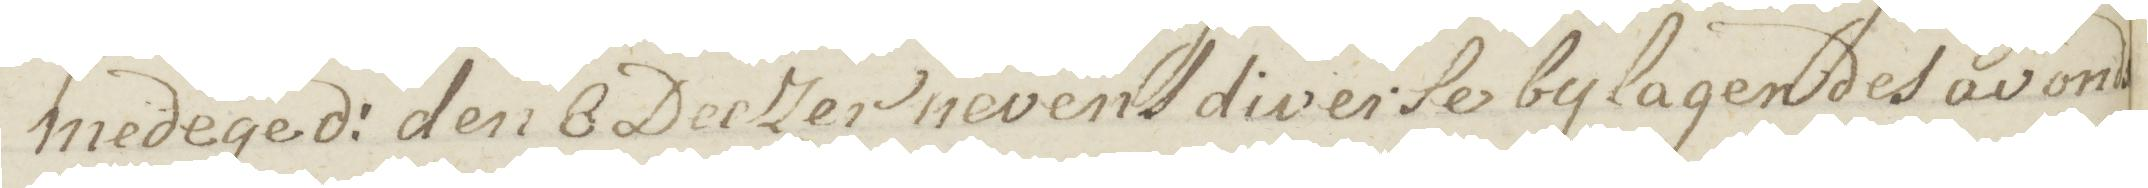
medeged: den 8 Deezer nevens diverse bylagen des avond
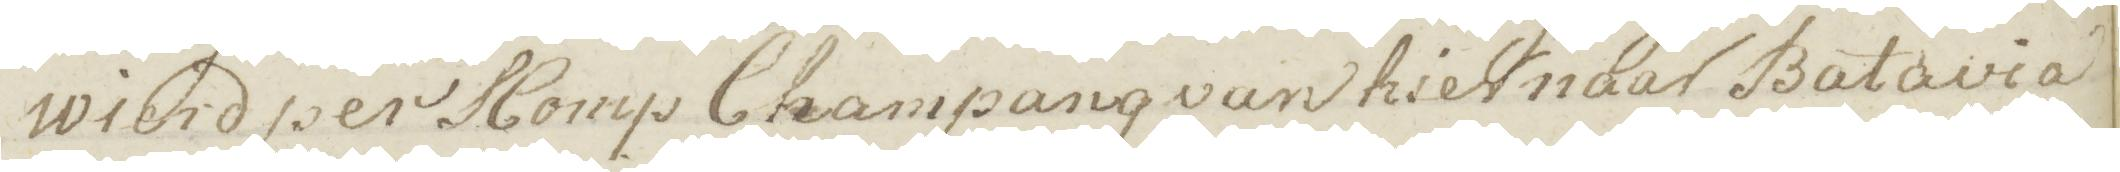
wierd per sComp Champang van hier naar Batavia
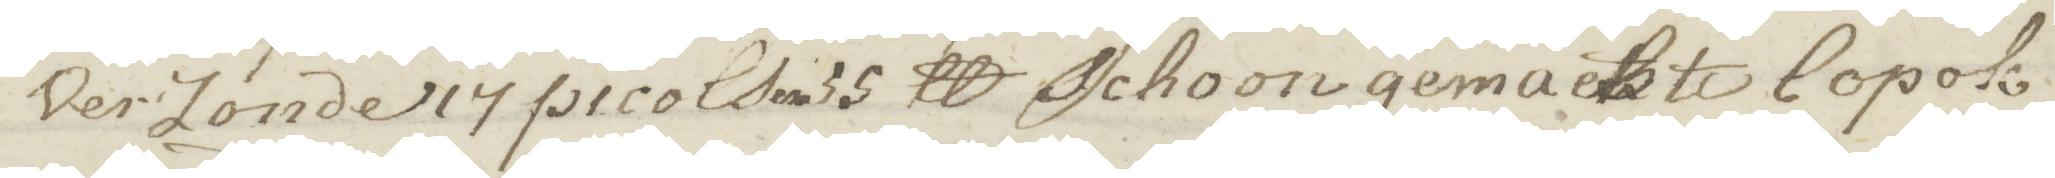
verzonde 17 picols en 35 lb schoon gemaekte Copok
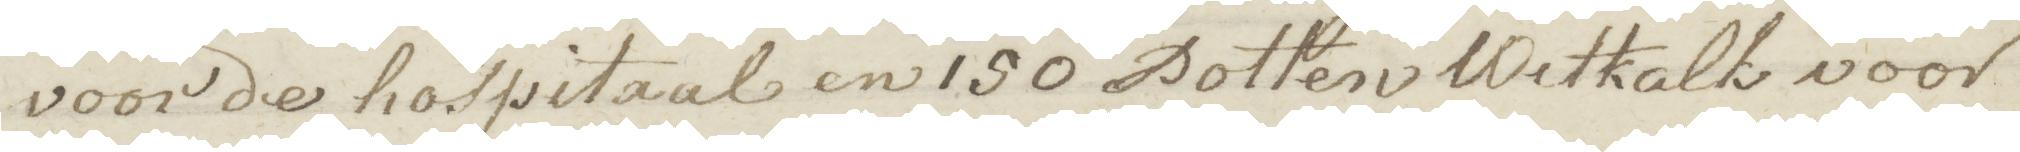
voor de hospitaal en 150 Potten Witkalk voor
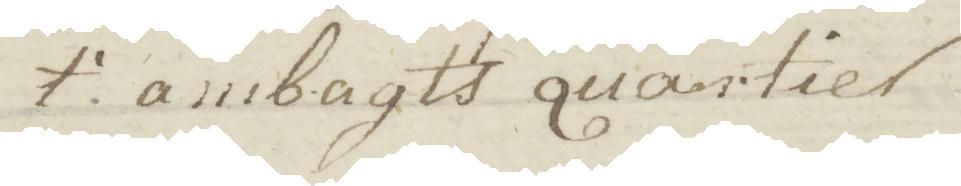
t' ambagts quartier
